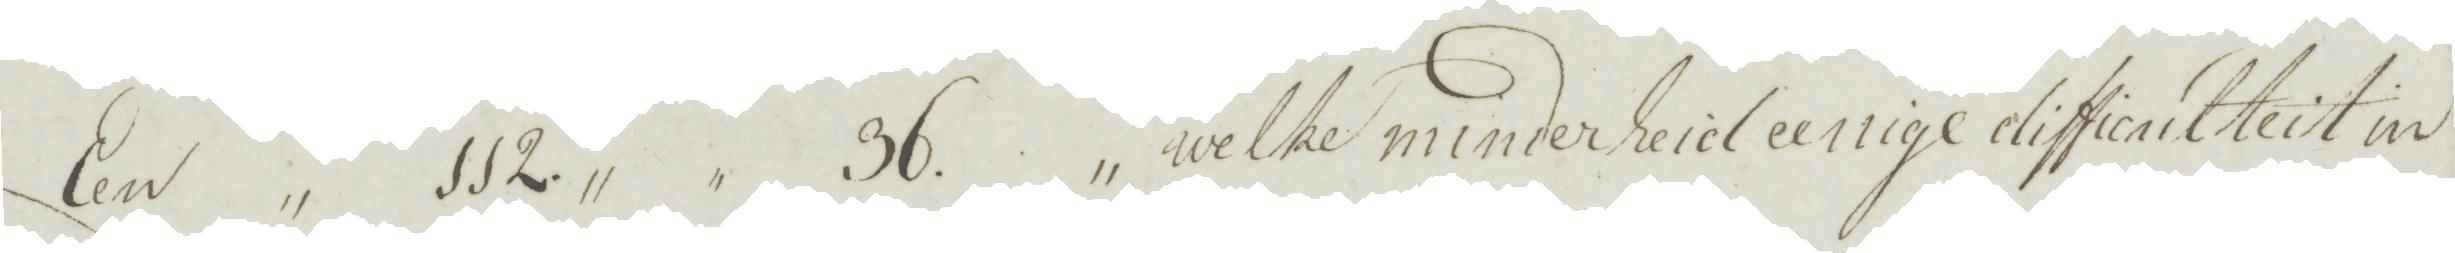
Een „ 112 „ „ 36. „ welke minderheid eenige difficulteit in
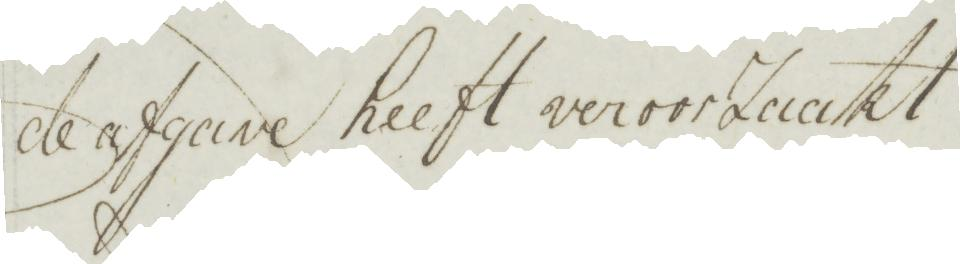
de afgave heeft veroorzaakt.
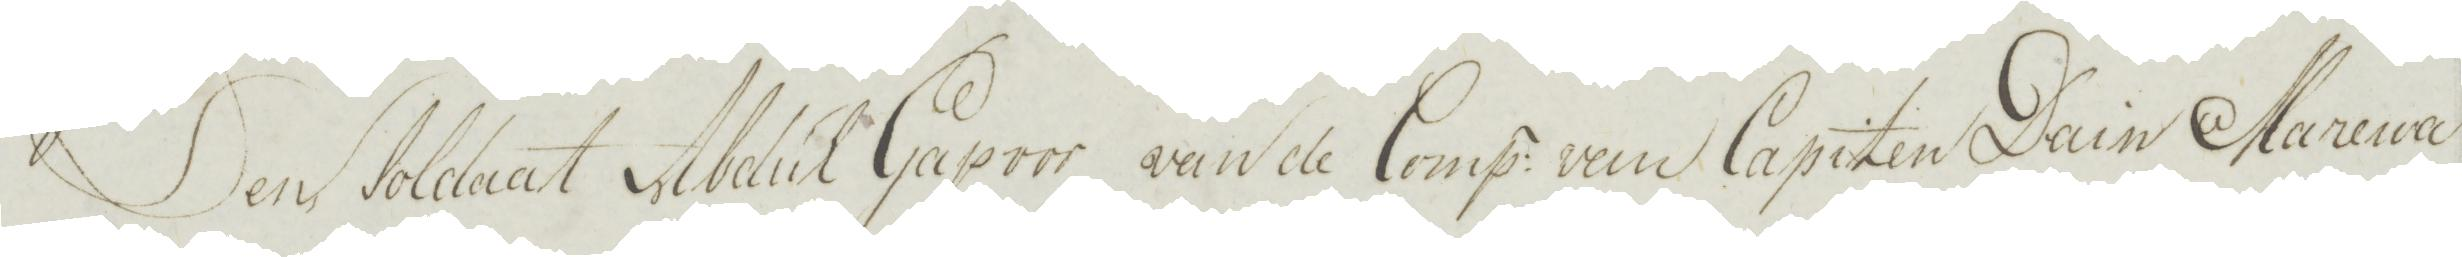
Den soldaat Abdul Gapoor van de Comp: van Capiten Dain Marewa
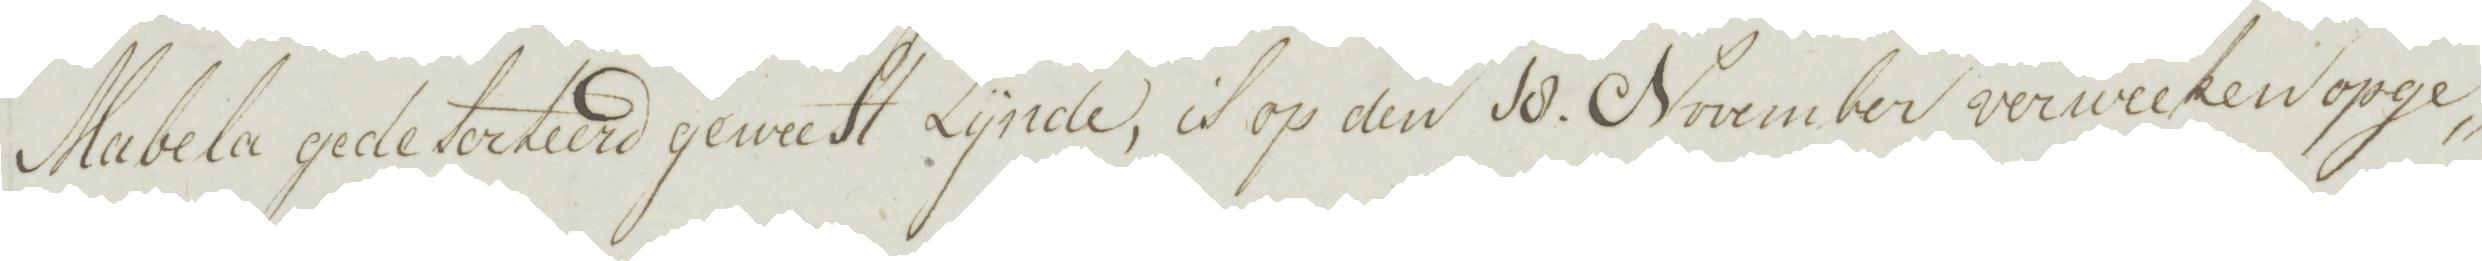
Mabela gedeserteerd geweest Zijnde, is op den 18. November verweeken opge„
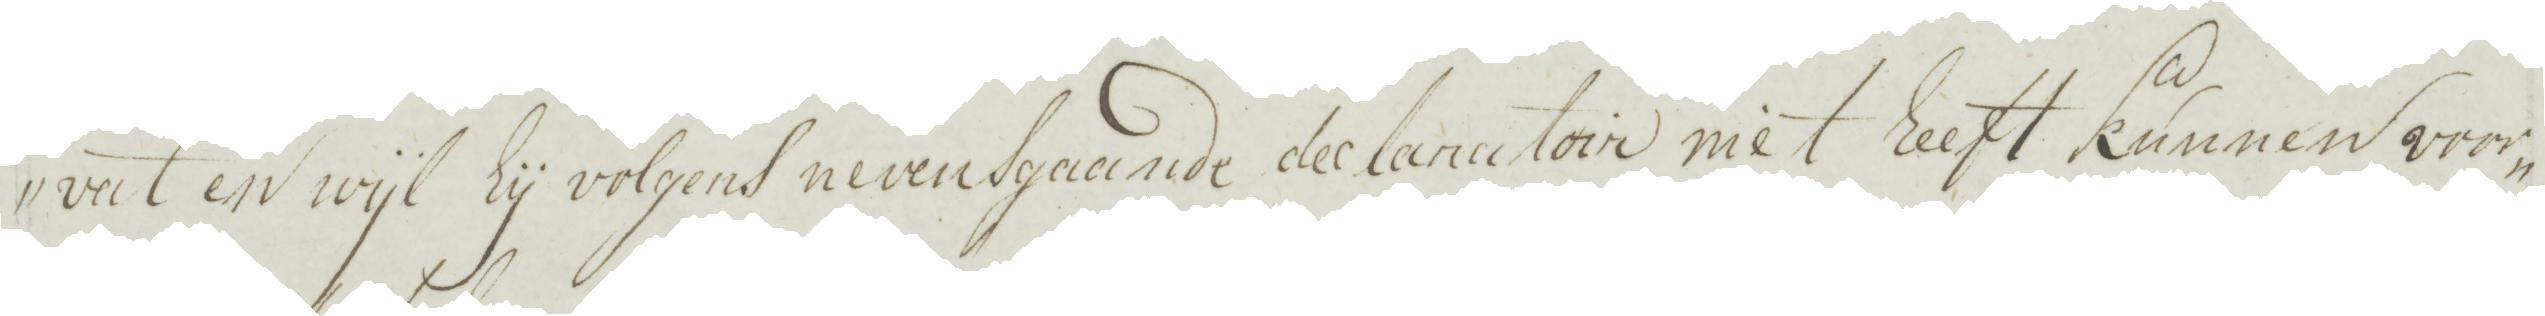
„vat en wijl hij volgens nevensgaande declaratoir niet heeft kunnen voor„
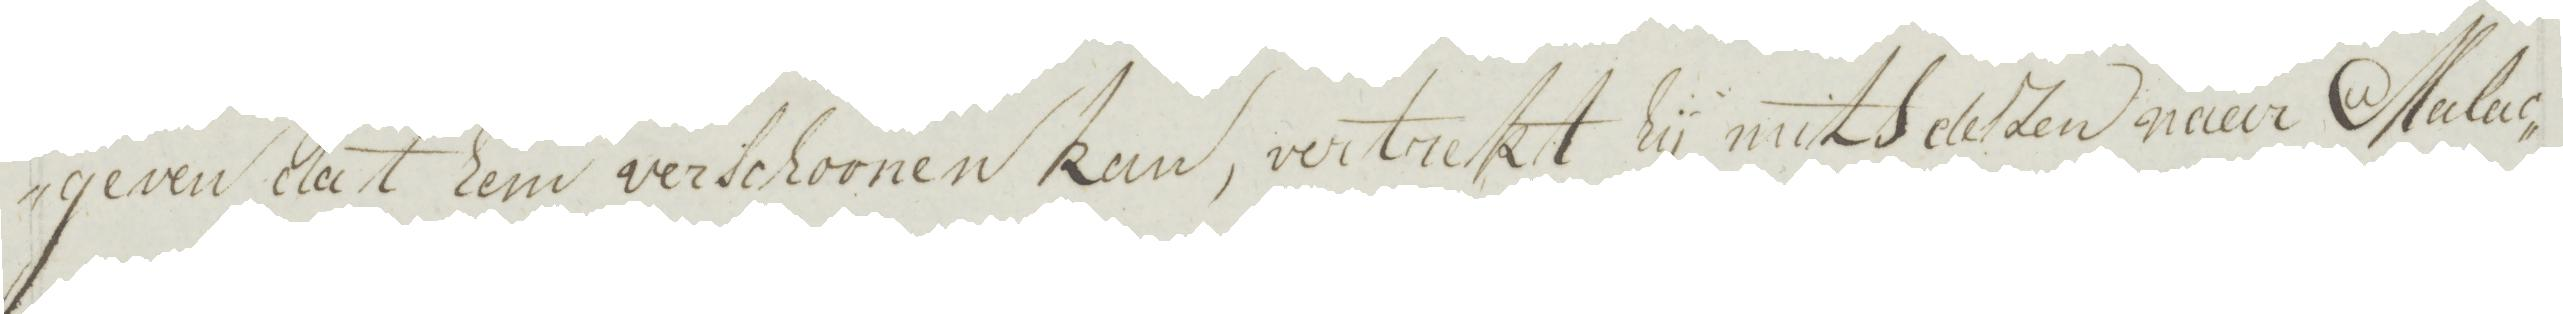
„geven dat hem verschoonen kan, vertrekt hij mits dezen naar Malac„
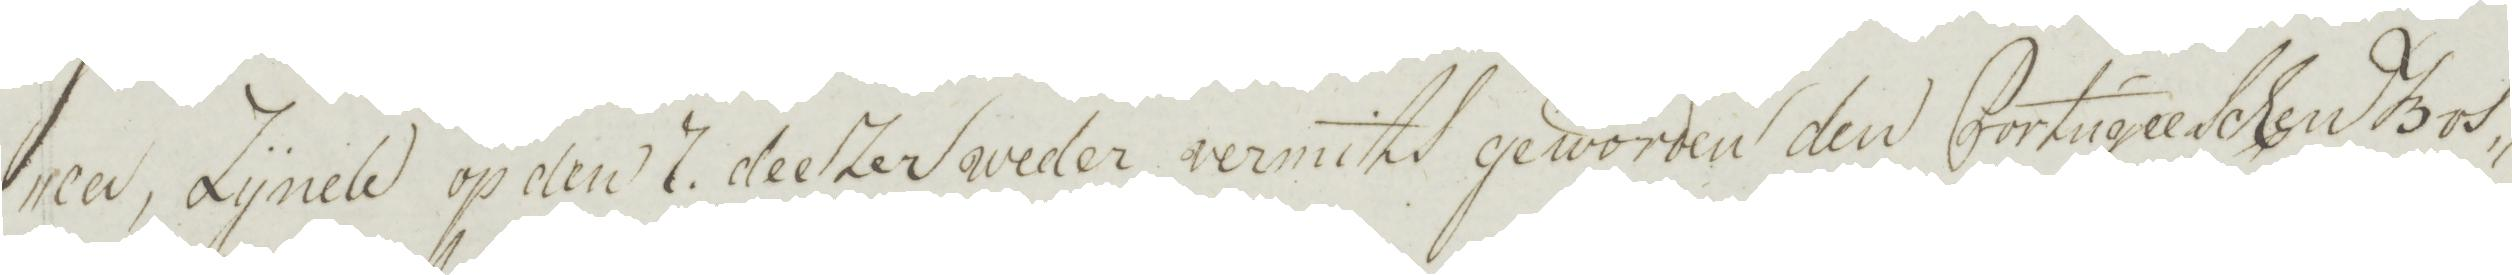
ca, Zijnde op den 7. deezer weder vermits geworden den Portugeeschen Bos„
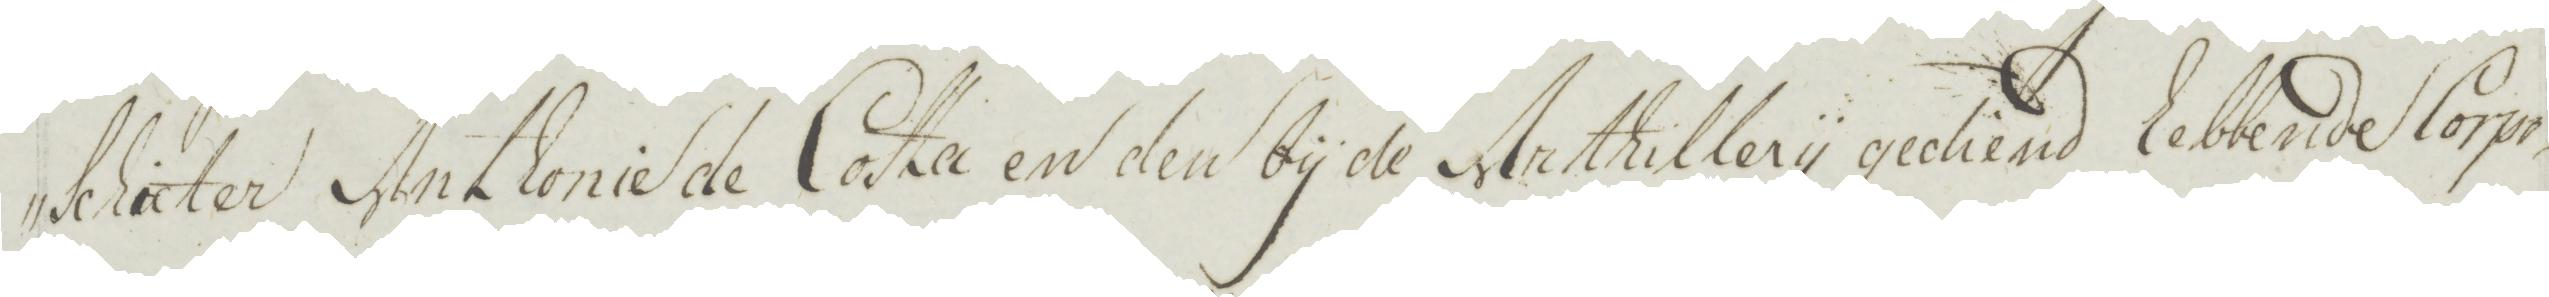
„schieter Anthonie de Costa en den bij de Arthillerij gediend hebbende Corpo„
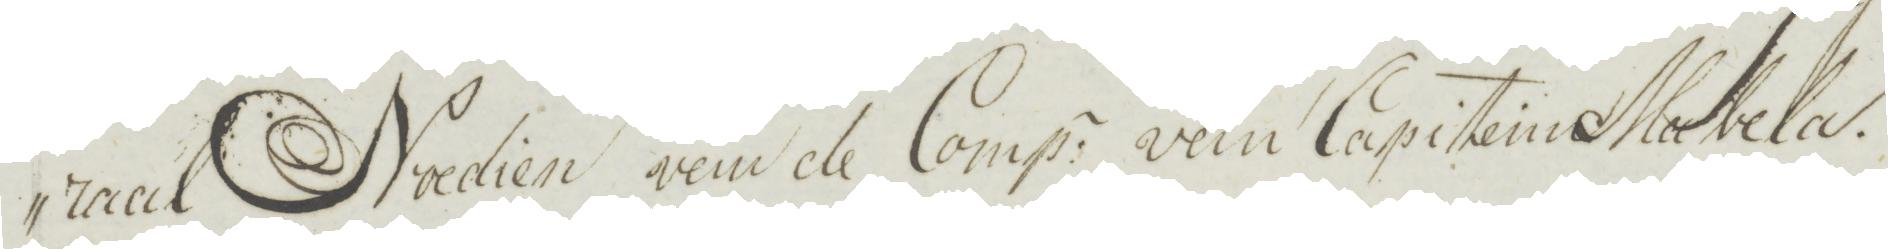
„raal Noedien van de Comp:' van Capitein Mabela.
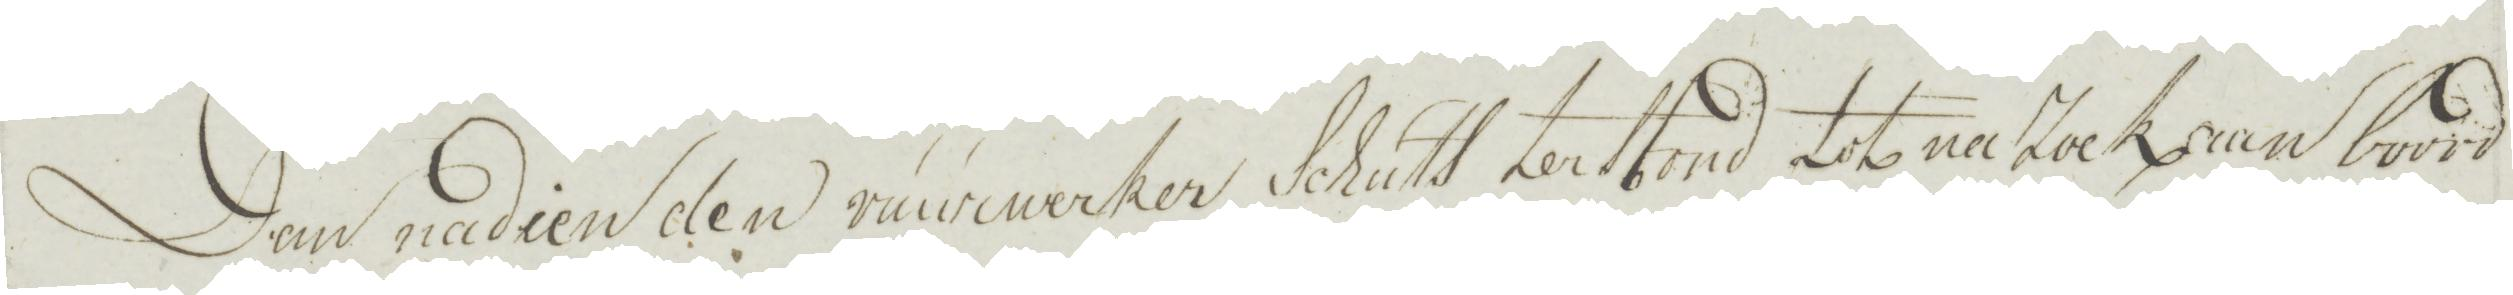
Dan nadien den vuurwerker Schuts ter stond tot na Zoek aan boord
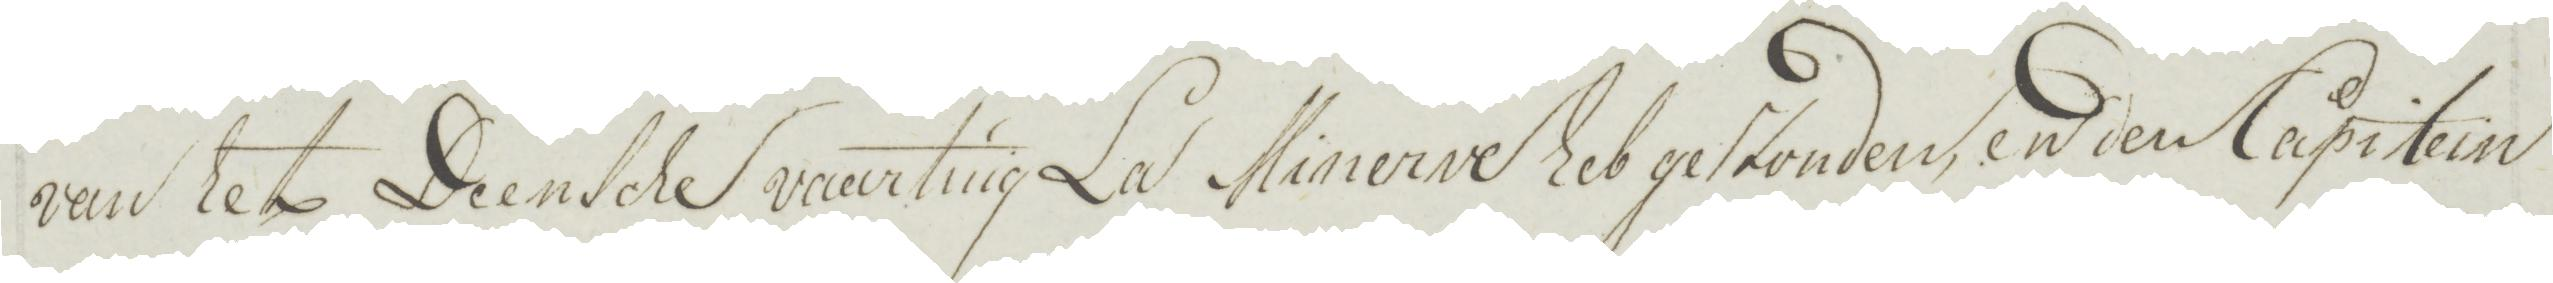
van het Deensche vaartuig La Minerve heb gezonden, en den Capitein
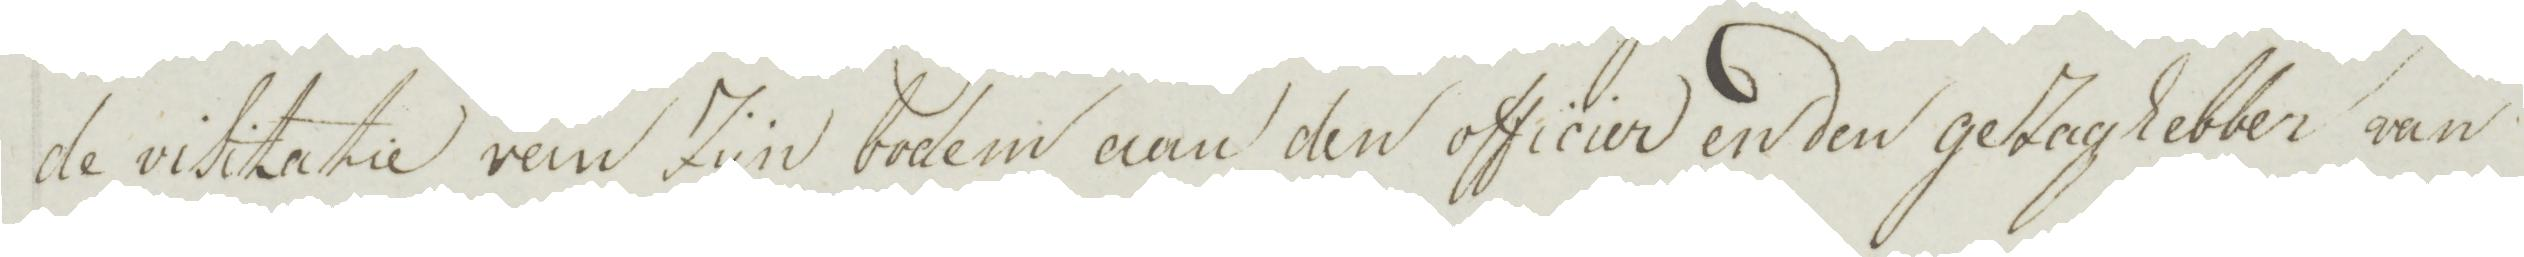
de vistatie van Zijn bodem aan den officier en den gezag hebber van
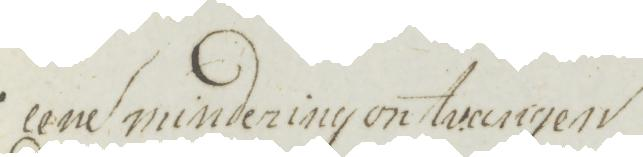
eene mindering ontvangen
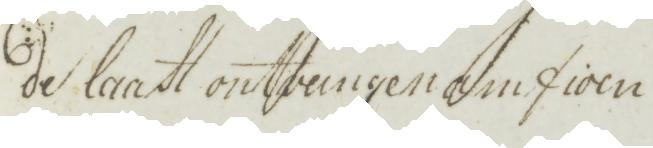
de laast ontvangen amfioen
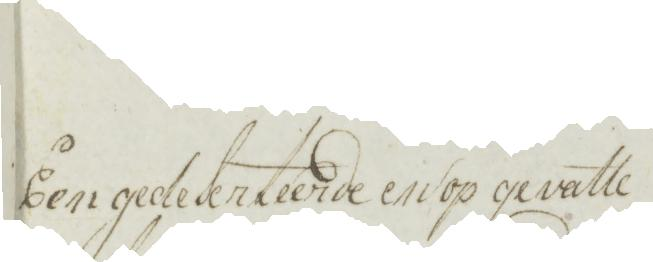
Een gedeserteerde en op gevatte
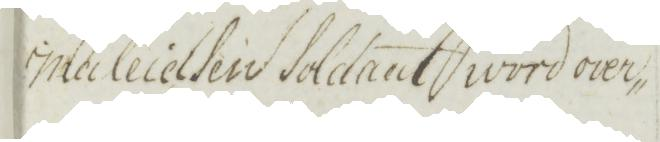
maleidsen soldaat word over„
